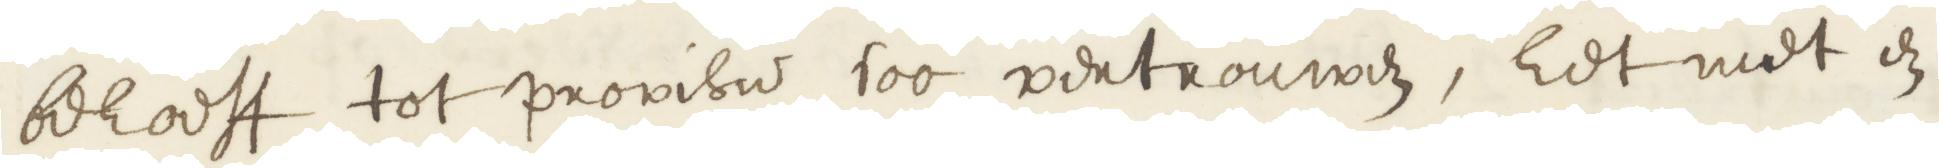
behoeft tot provisie soo vertrouwen, het niet en
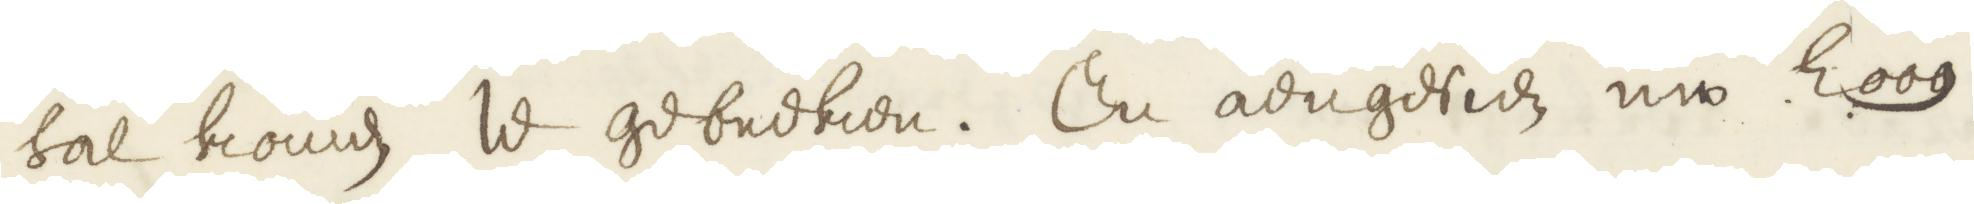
sal komen te gebreken. En aengesien uw hoog
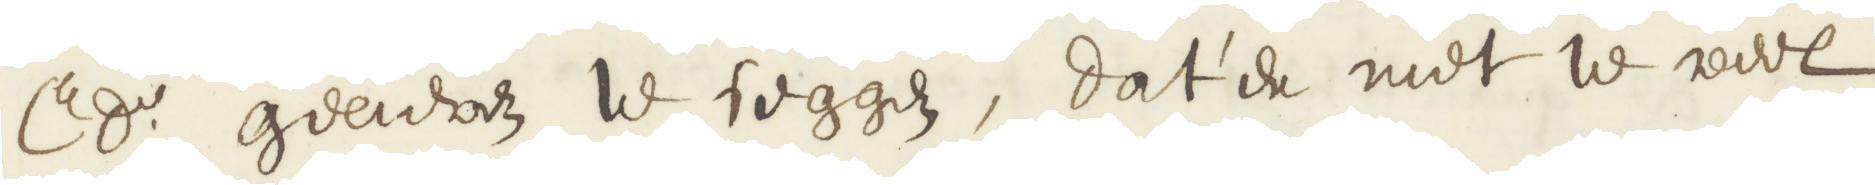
Ed:s gelieven te seggen, dat'er niet te veel
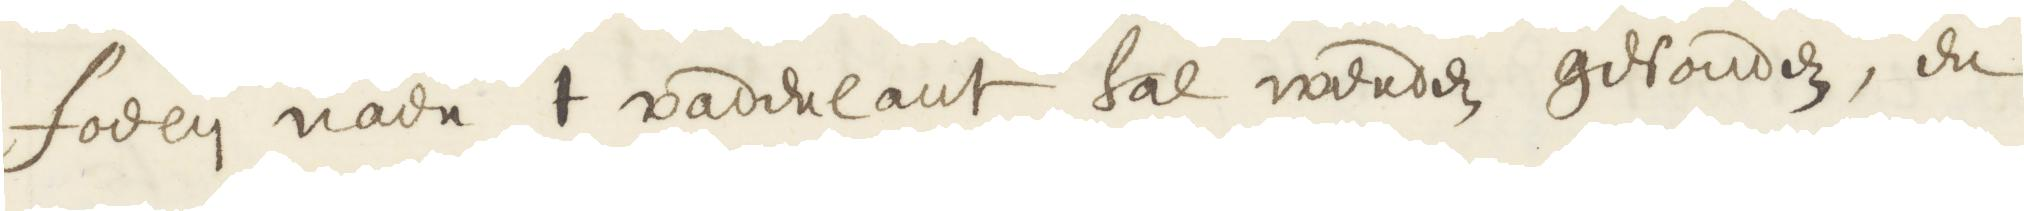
foelij naer ’t vaderlant sal werden gesonden, en
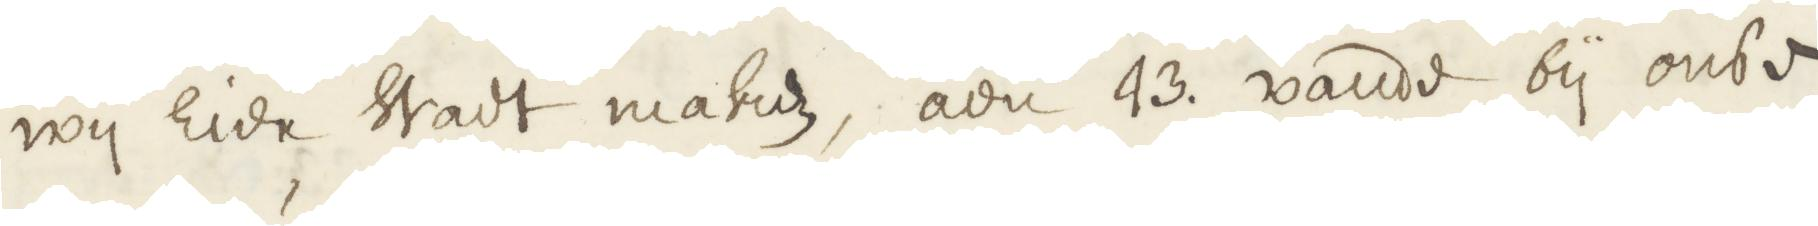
wij hier staet maken, aen 43. vande bij onse
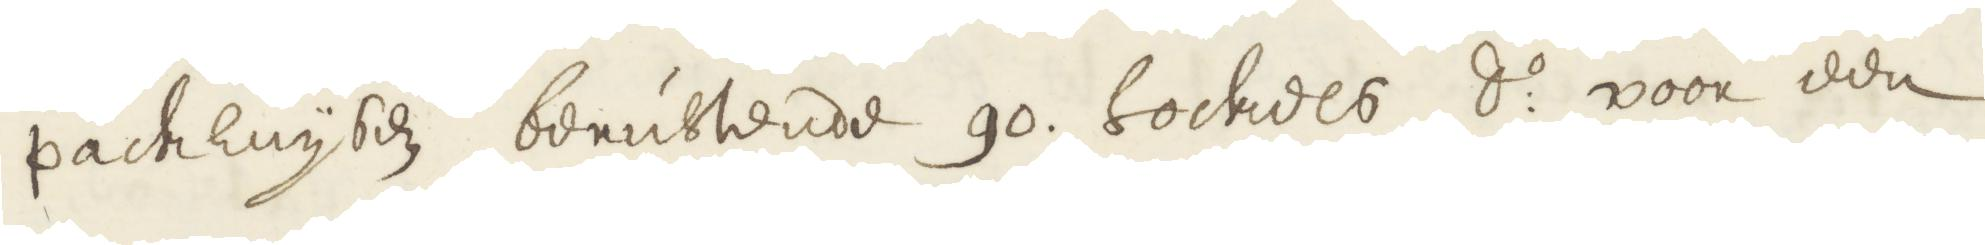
packhuijsen berustende 90. sockels d:o voor een
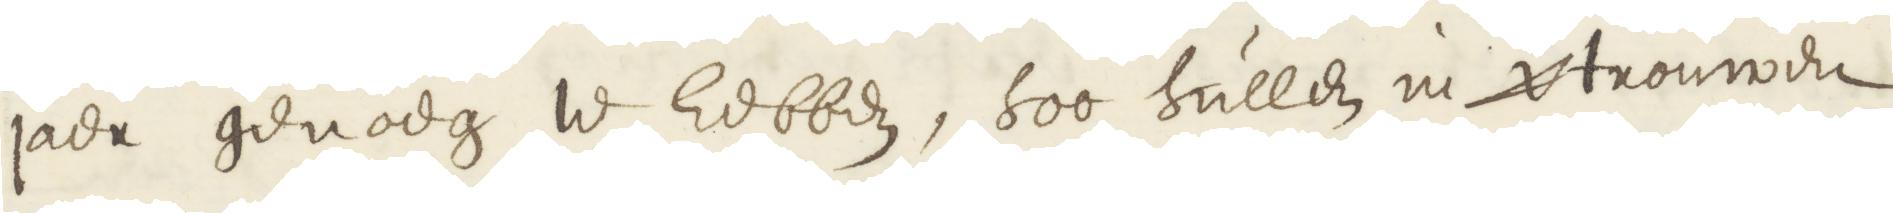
jaer genoeg te hebben, soo sullen in vertrouwen
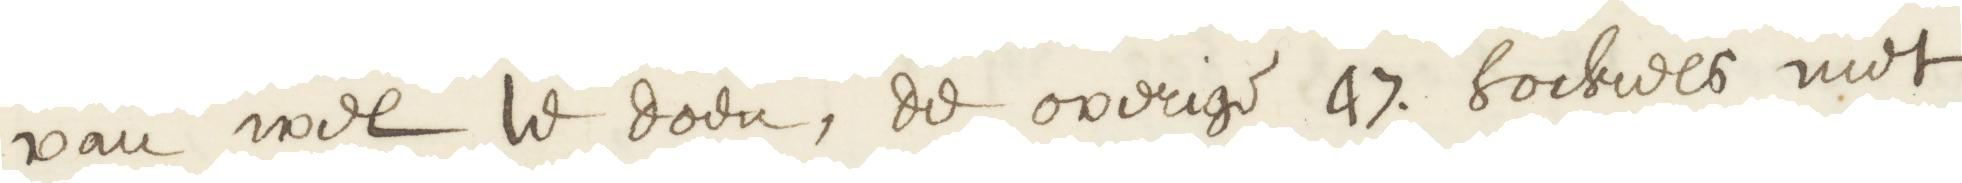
van wel te doen, de overige 47. sockels met
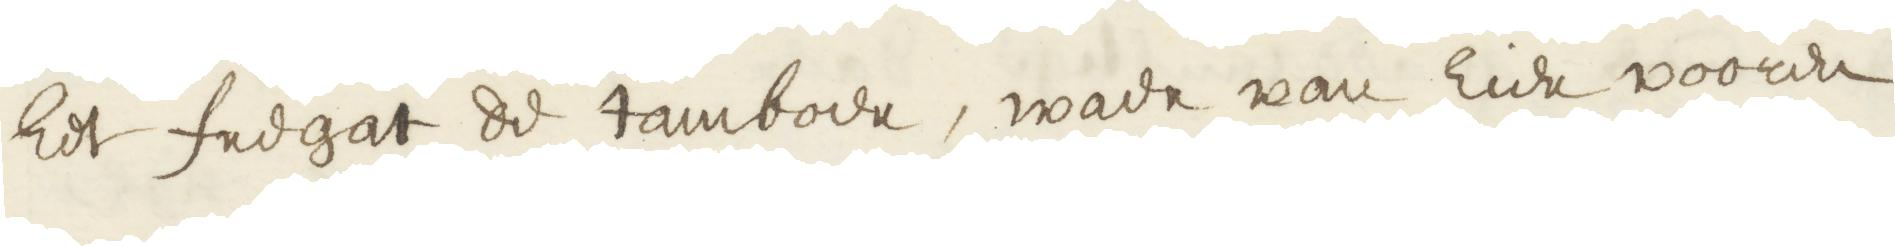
het fregat de tamboer, waer van hier vooren
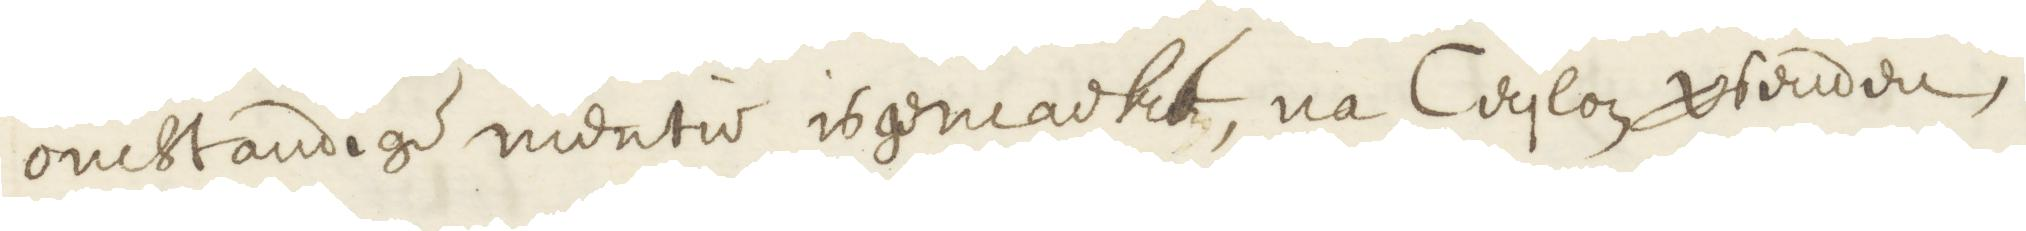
omstandige mentie is gemaekt, na Ceijlon versenden,
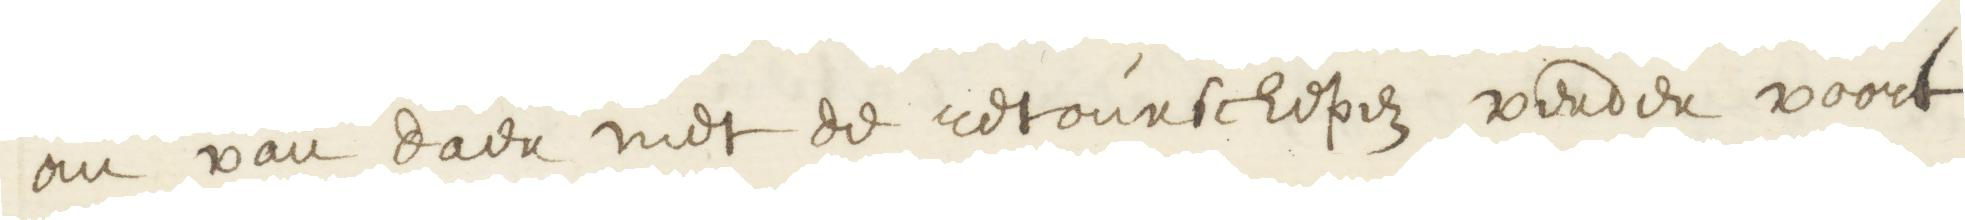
om van daer met de retourschepen verder voort
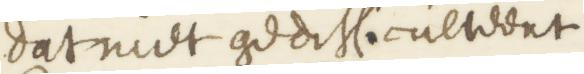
dat niet gedifficulteert
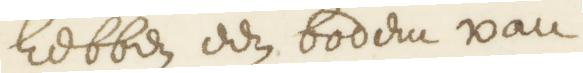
hebben een bodem van
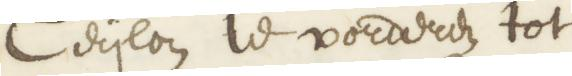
Ceijlon te vorderen tot
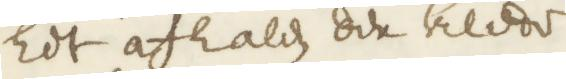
het afhalen der klede
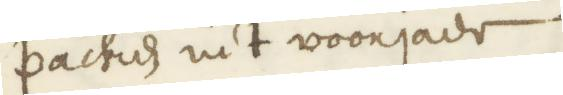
packen in’t voorjaer
